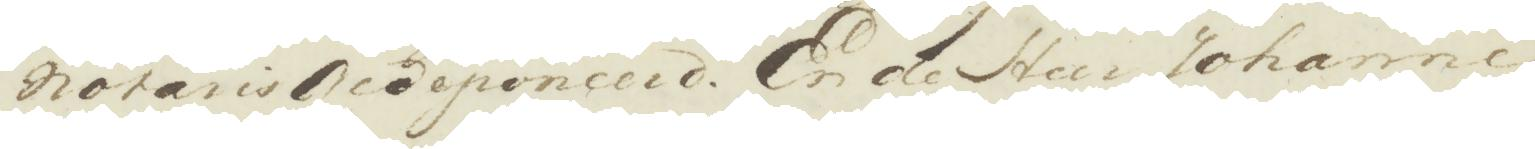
Notaris Gedeponeerd. En de Heer Johannes ¶
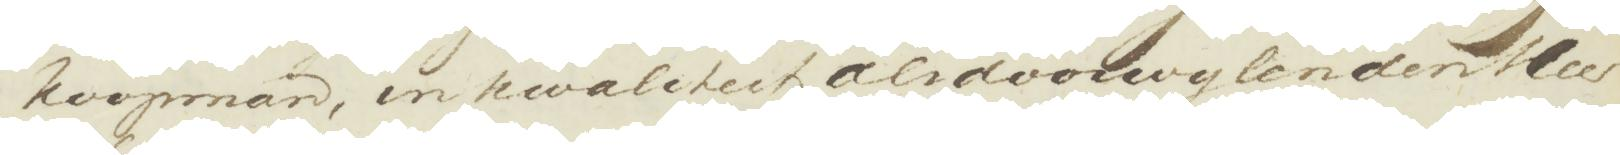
koopman, in kwaliteit als doorwylen den Heer
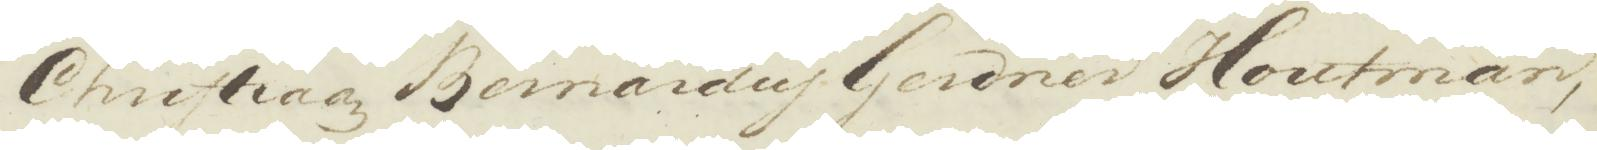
Christiaan Bernardus Gerdner Houtman,
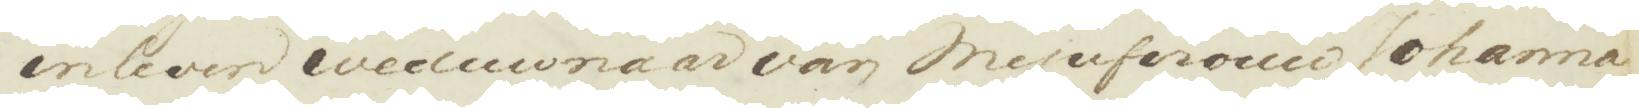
in leven weduwnaar van Mejufvrouw Johanna
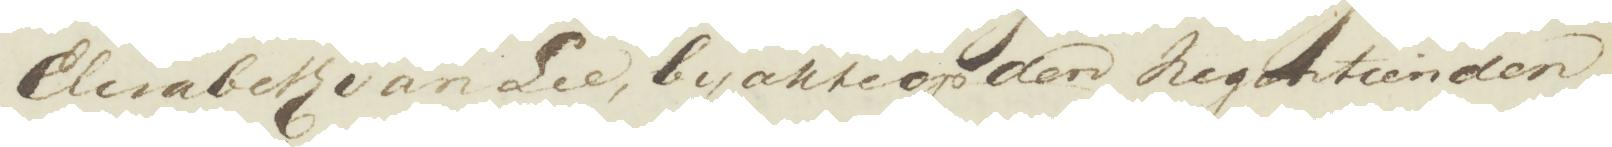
Elisabeth van Lee, by akte op den Negentienden
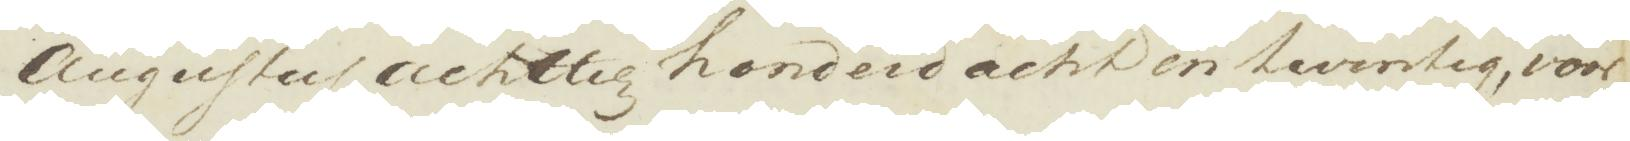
Augustus achttien honderd acht en twintig, voor
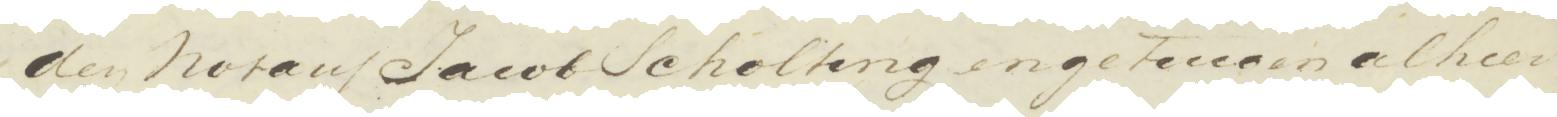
den Notaris Iacob Scholting en getuigen alhier
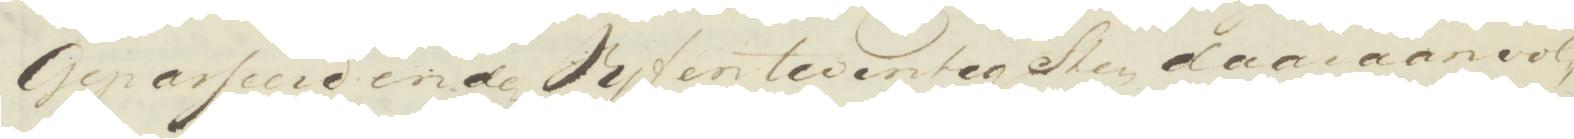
Gepasseerd en de Vyf en twintigsten daaraan vol
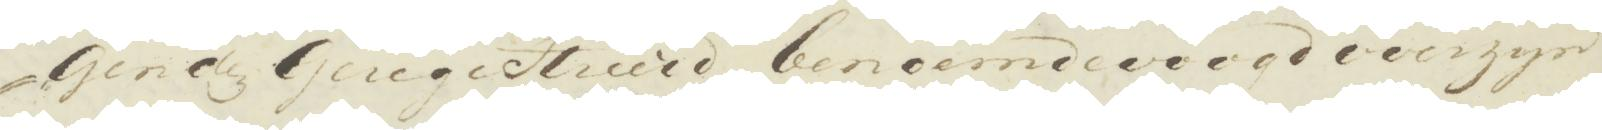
=gende Geregistreerd, benoemde voogd over zyn
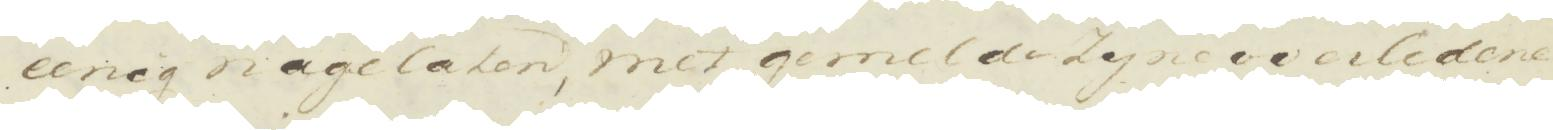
eenig nagelaten, met gemelde zyne overledene
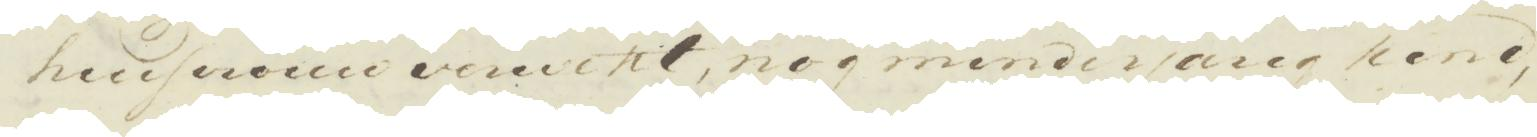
huisvrouw verwekt, nog minderjarig kind,
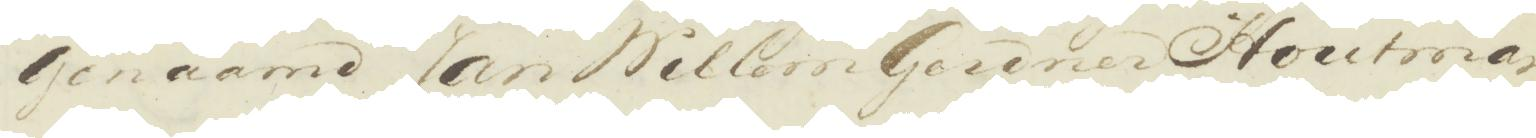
Genaamd Jan Willem Gerdner Houtman
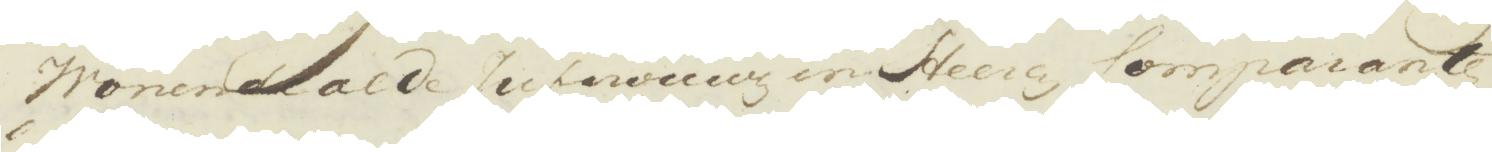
Wonende alde Jufvrouwen en Heeren Comparanten
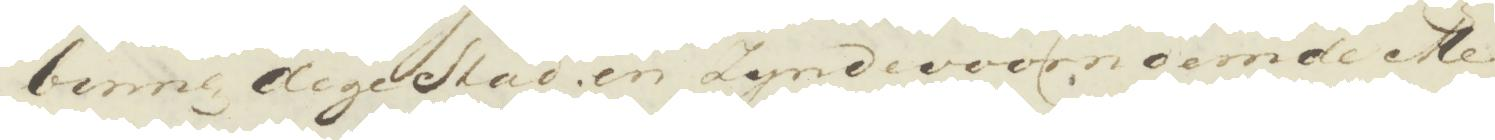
binnen deze stad. en zynde voornoemde Me
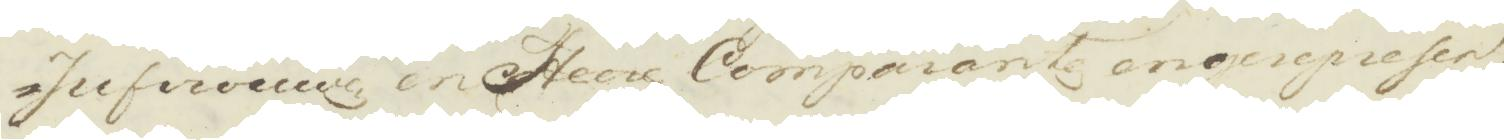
=jufvrouwen en Heeren Comparanten en gerepresen
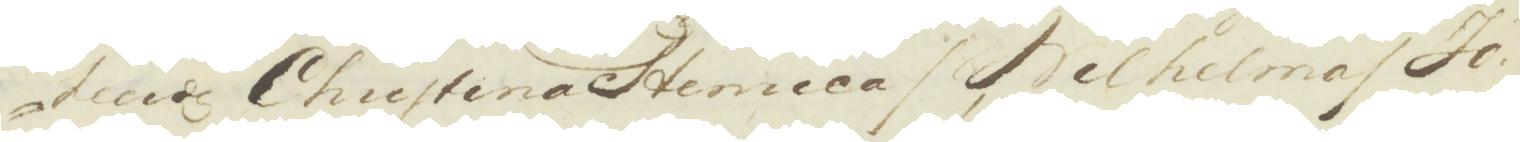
=teerde Christina Henrica / Wilhelma/ Jo„
